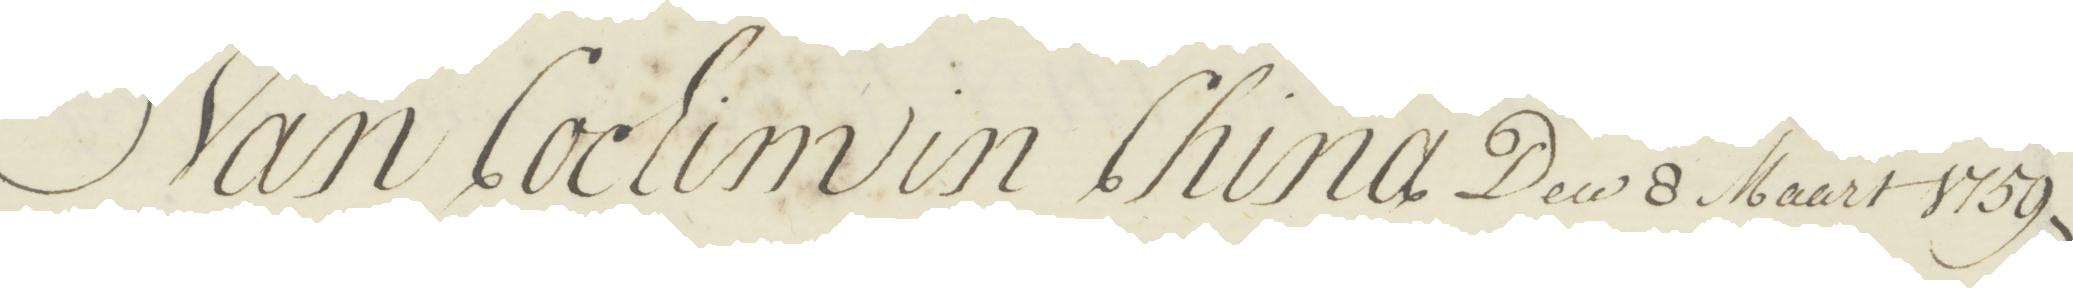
Van Cochim in China Den 8 Maart 1759,
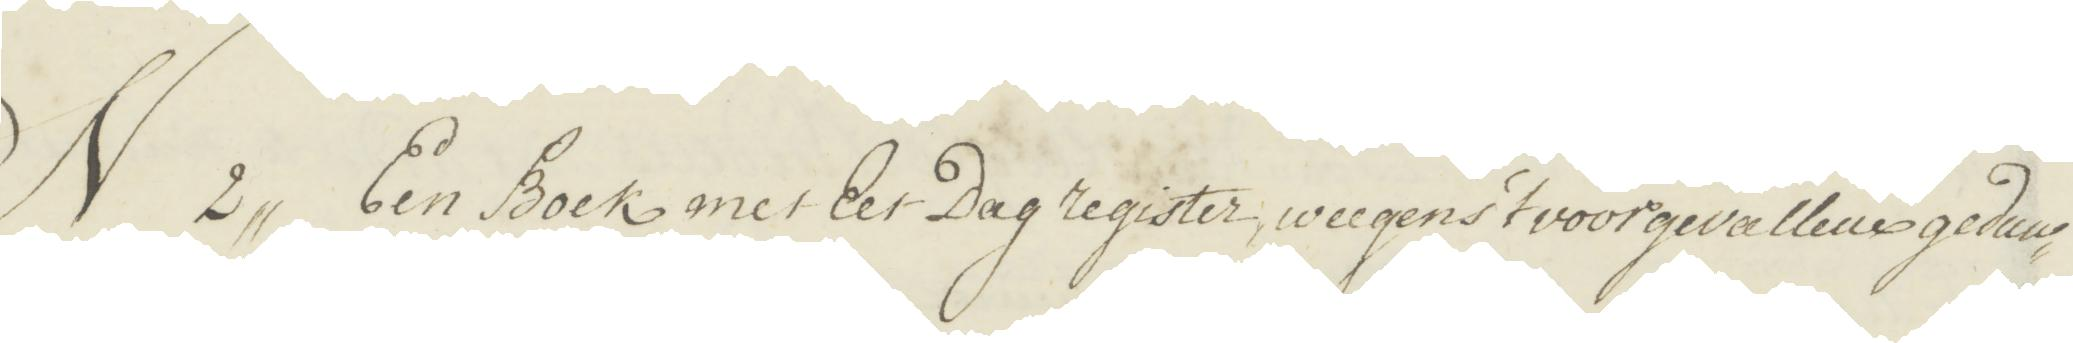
No 2„=o Een Boek met het Dag register, weegens 't voor gevallene geduu„
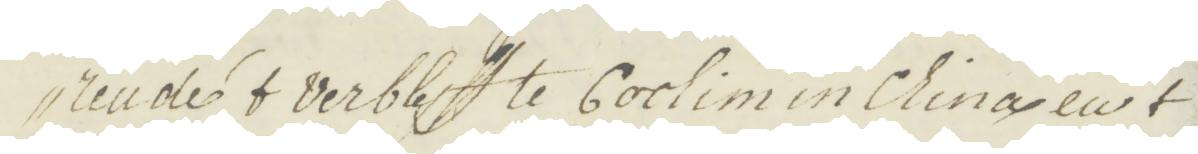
„rende 't verblyff te cochim in china en 't
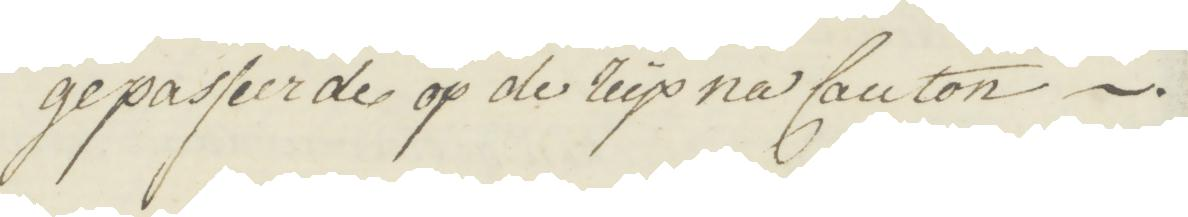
gepasseerde op de reijs na Canton.
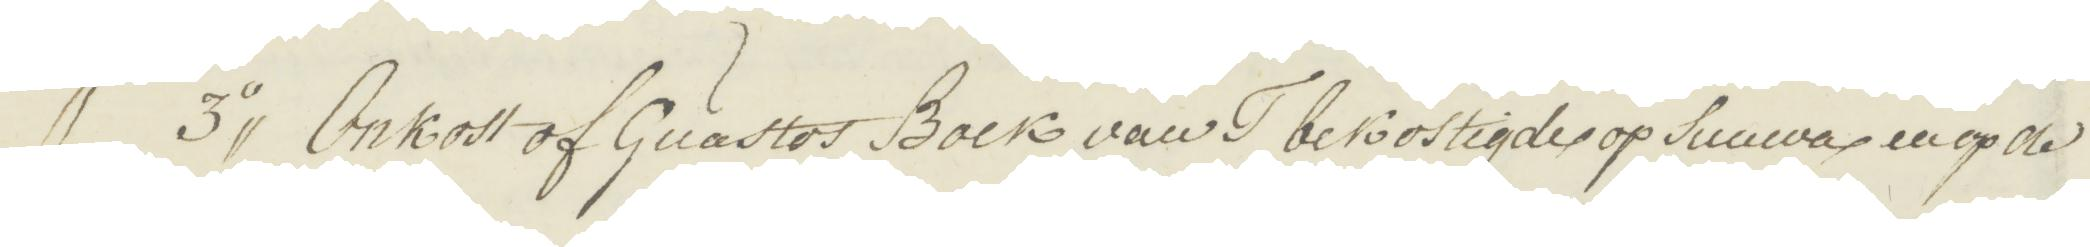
„ 3„' Onkost of Guastos Boek van T bekostigde op suuwa en op de
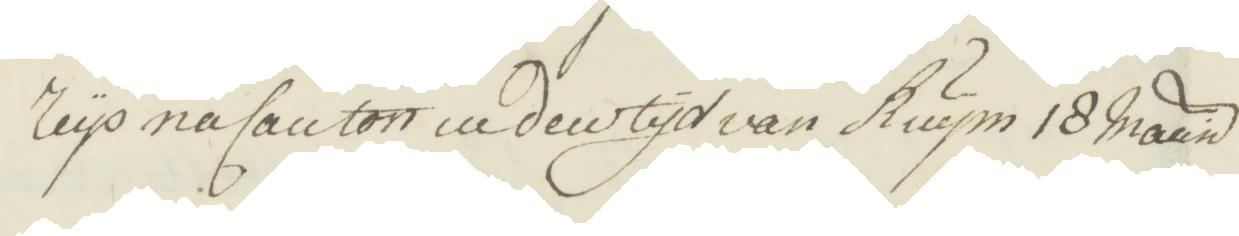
reijs na Canton in den tijd van Ruijm 18 maand
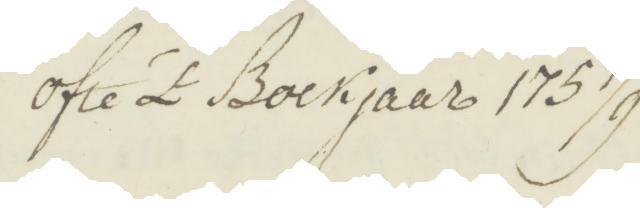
ofte 't Boekjaar 1757/9
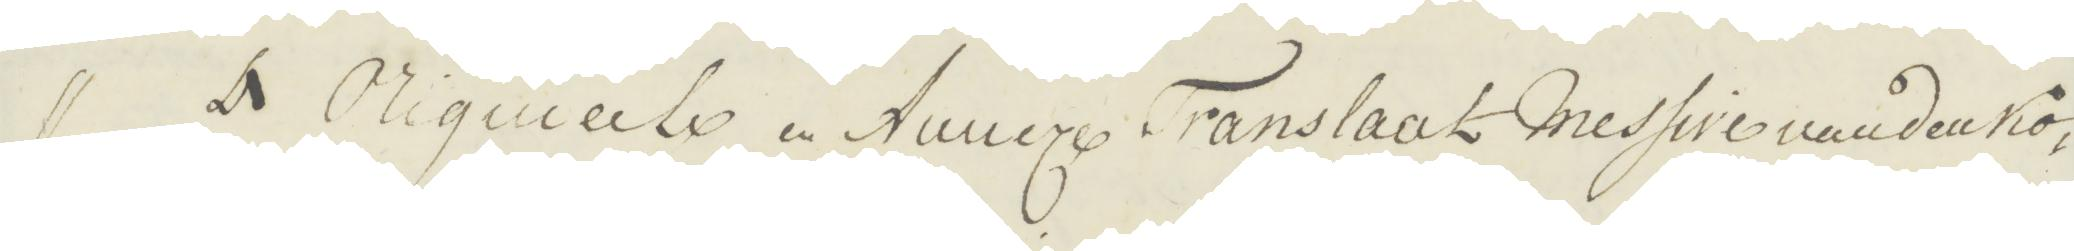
„ 4 Origineele en Annexe Translaat messive van den ko„
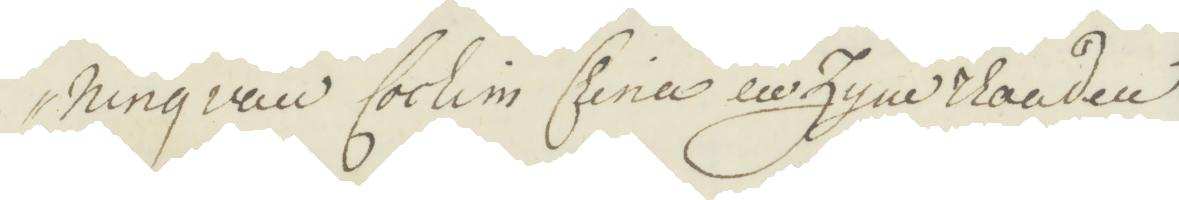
„ning van Cochim China en Zyne rhaaden
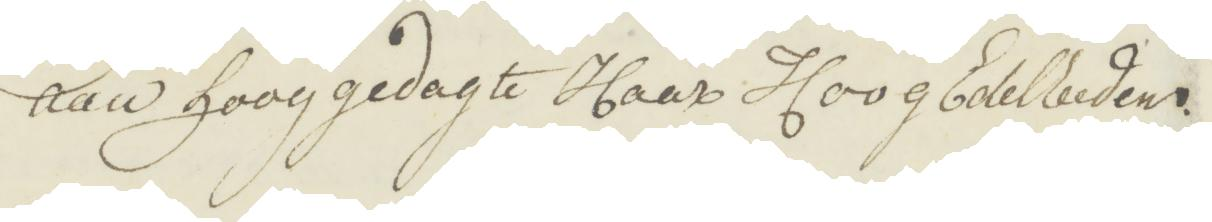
aan hoog gedagte Haar Hoog Edelheeden.
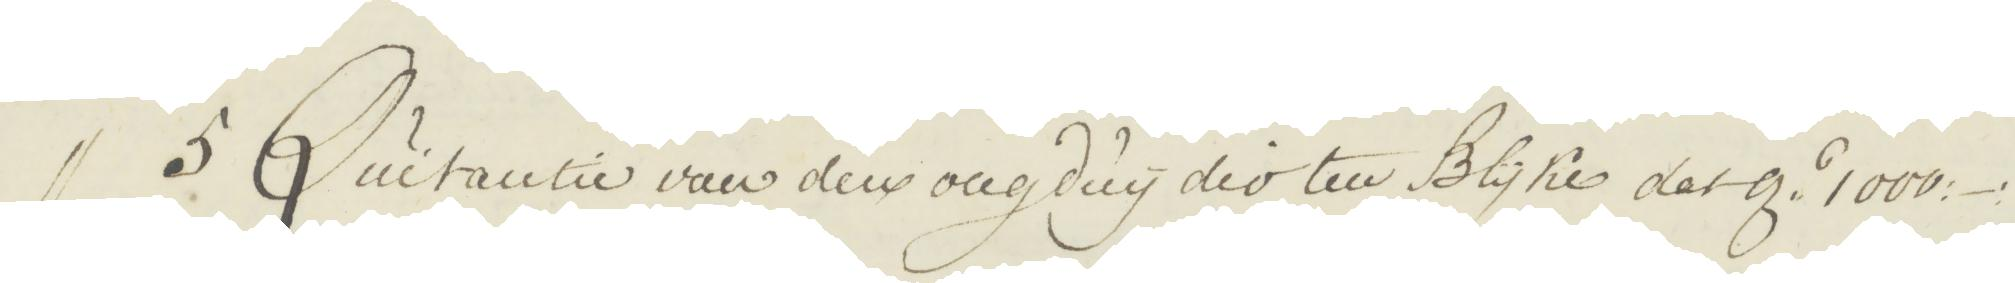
„ 5 Quitantie van den ongduij dio ten Blijke dat q:s 1000:—:
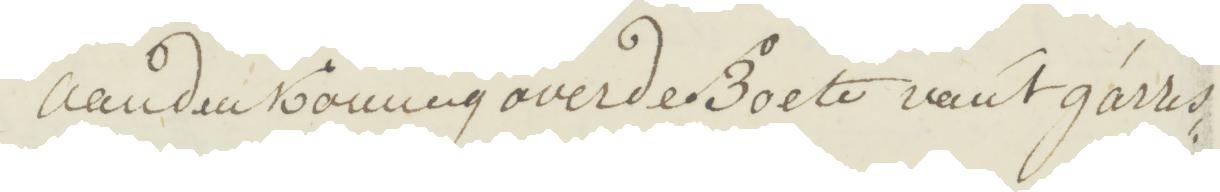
aanden koning over de Boete van 't g'arres„
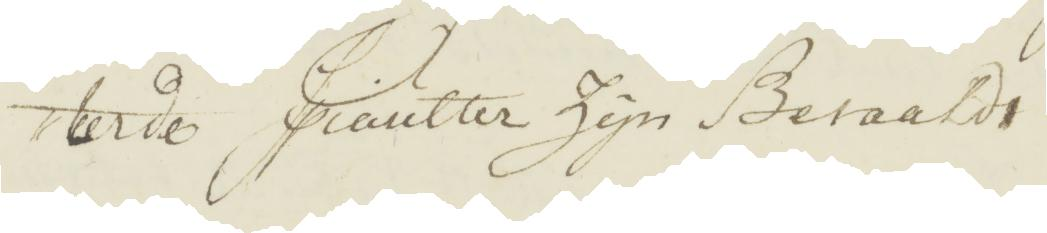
„teerde spiaulter Zijn Betaaldt
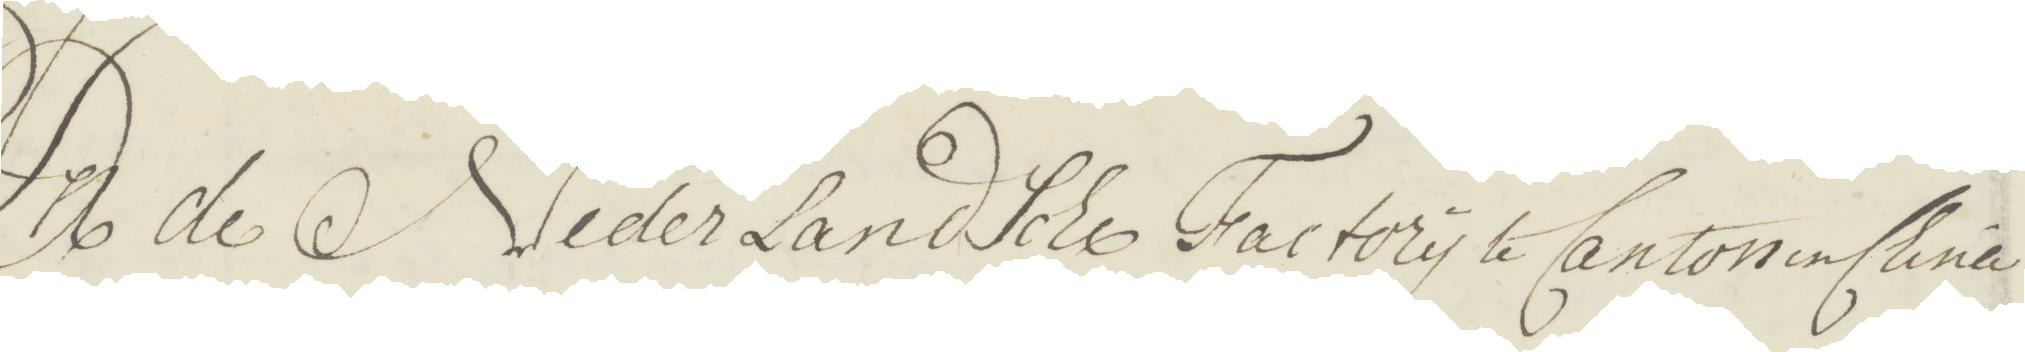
In de Nederlandsche Factorij te Canton in China
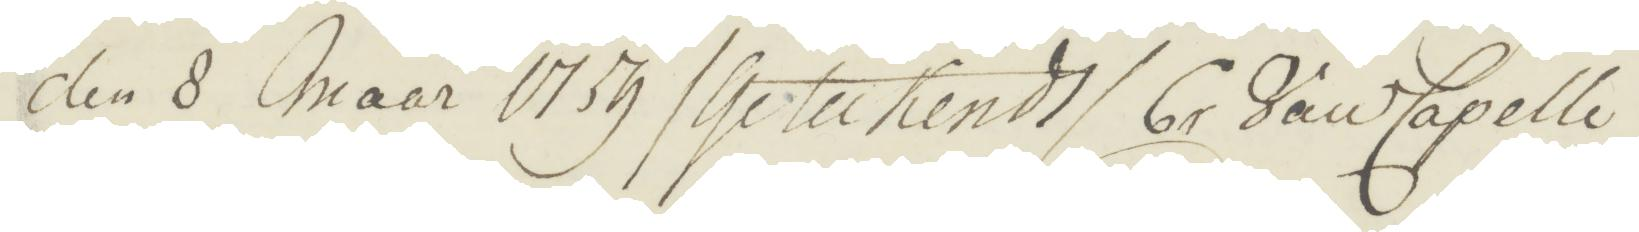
den 8 maar 1759 /geteekendt/ Cr Van Capelle
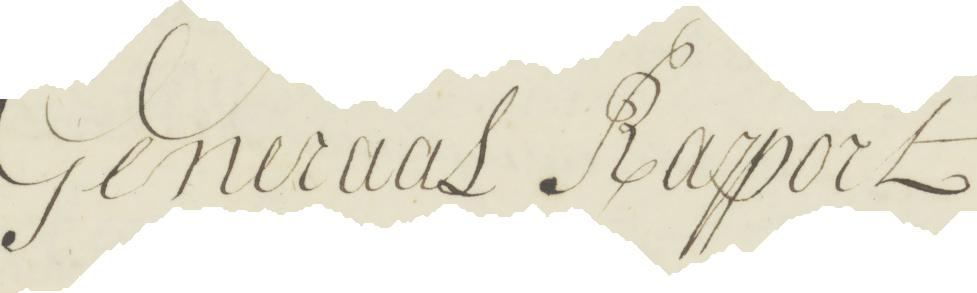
Generaal Rapport
